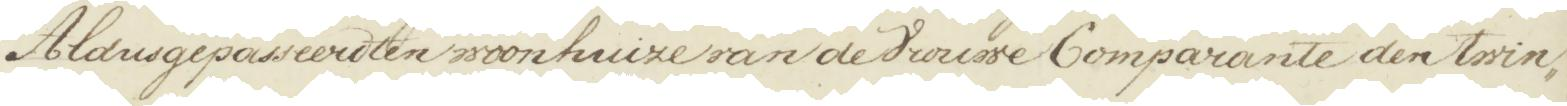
Aldus gepasseerd ten woonhuize van de Vrouwe Comparante den twin„
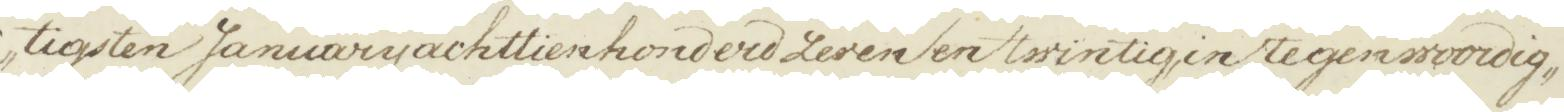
„tigsten January achttienhonderd zeven en twintig, in tegenwoordig„
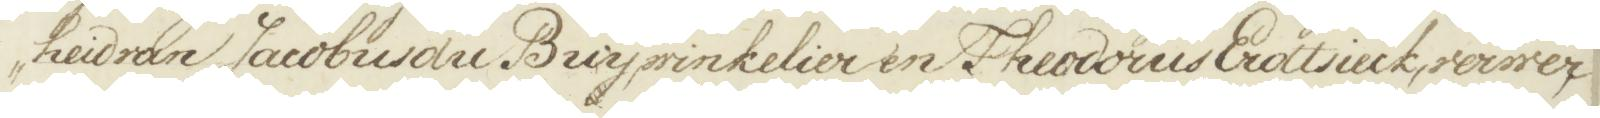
„heid van Jacobus du Buy, winkelier en Theodorus Erdtsieck, verwer
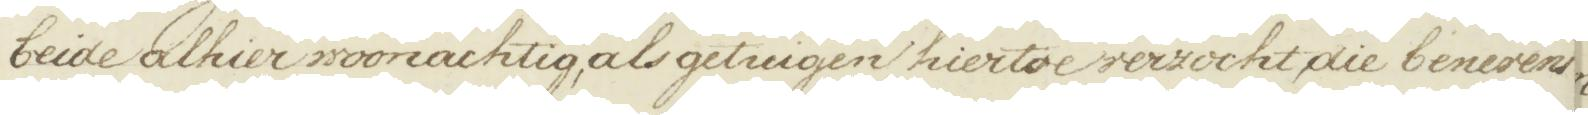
beide alhier woonachtig, als getuigen hiertoe verzocht, die benevens
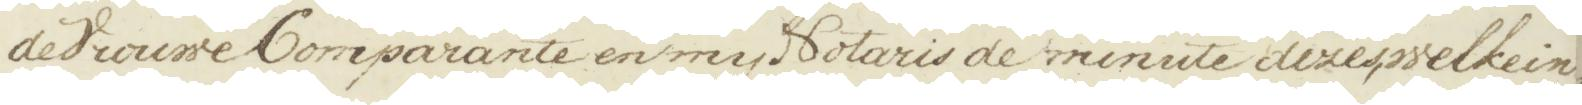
de Vrouwe Comparante en my Notaris de minute dezes, welke in
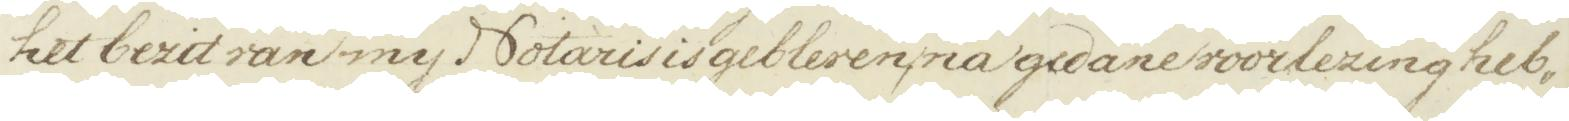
het bezit van my Notaris is gebleven, na gedane voorlezing heb„
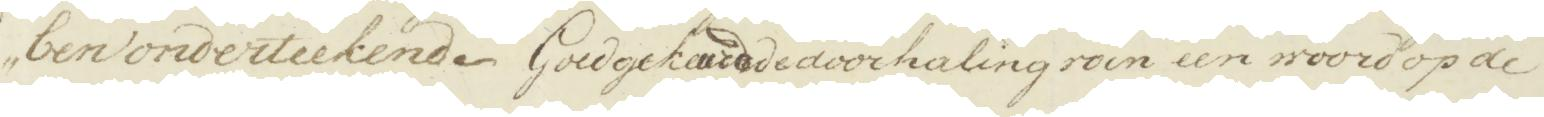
„ben onderteekend_ Goedgekeurd de doorhaling van een woord op de
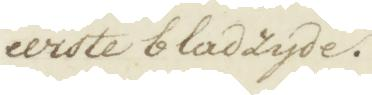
eerste bladzyde.
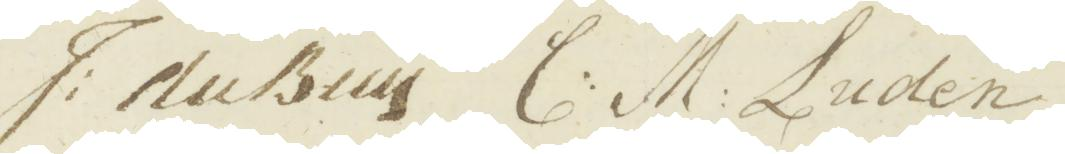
J: du Buy C: M: Luden
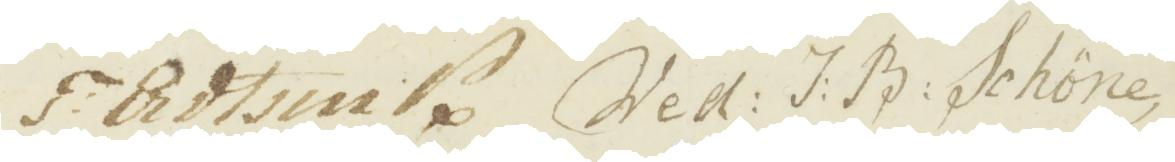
T: Erdtsieck Wed: J: B: Schône
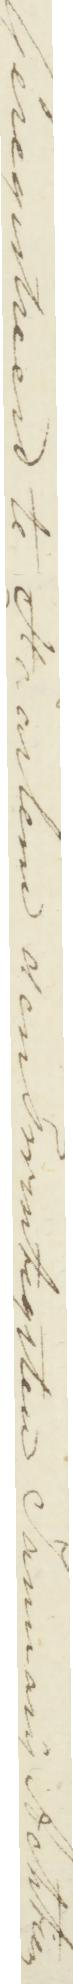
Geregistreerd te Haarlem den Twintigsten Januarij Achtien
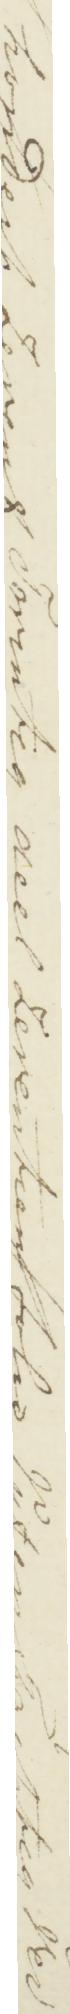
hondert Zeven & Twintig deel Zeventien folio Vijf en Tachtig Ver
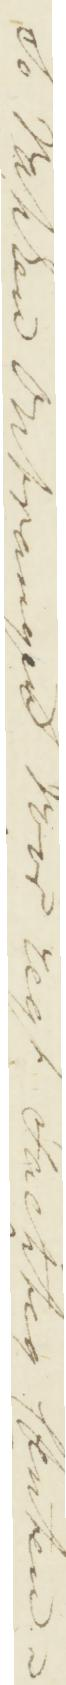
so Vak Een ontvangen voor regt Tachtig Centen.-
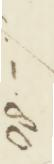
f -.80
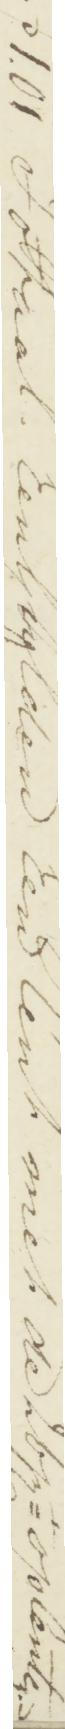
f1.01 Totaal Een Gulden Een Cent met de 26 pC=t opCenten
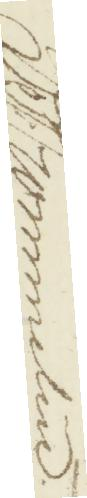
D. F. Crommelin
